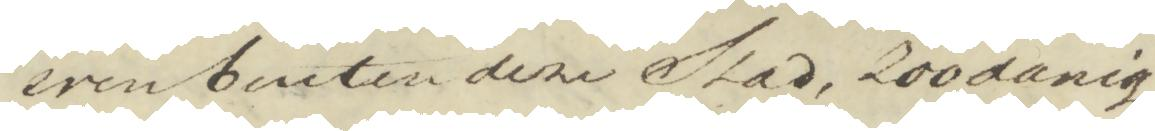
even buiten deze Stad, zoodanig
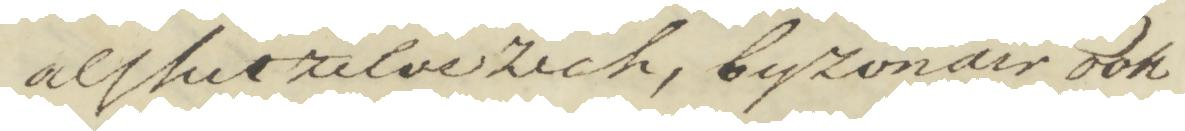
als het zelve zich, byzonder ook
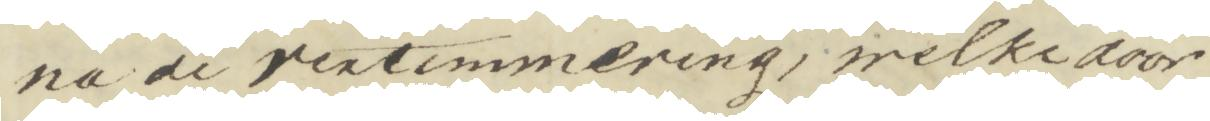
na de vertimmering, welke door
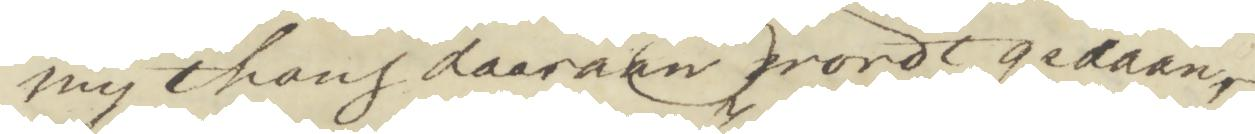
mij thans daaraan wordt gedaan,
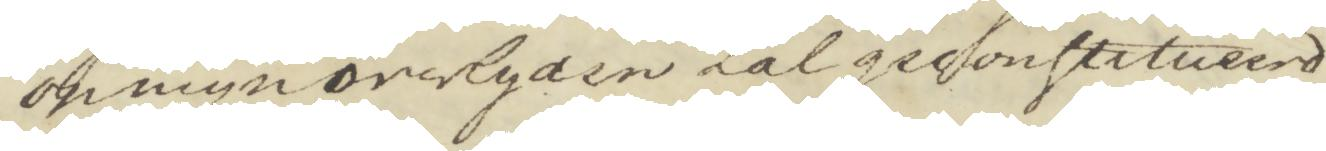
op myn overlijden zal geconstitueerd
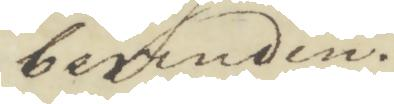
bevinden.
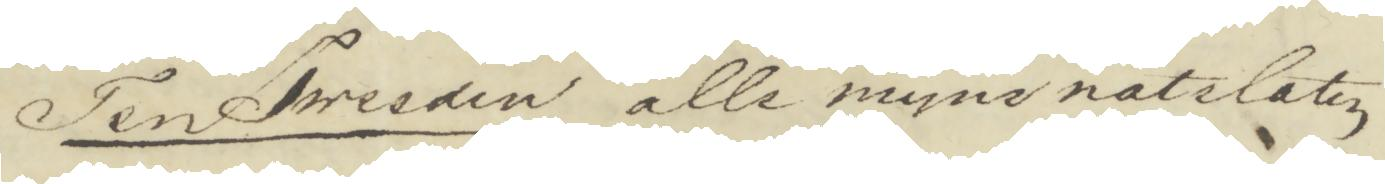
Ten Tweeden alle myne natelaten
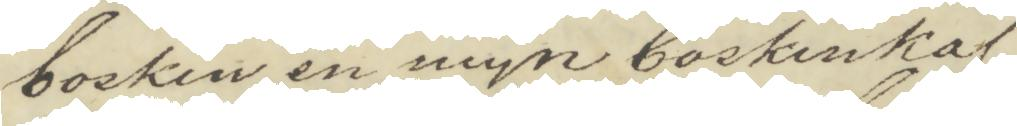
boeken en myn boekenkas
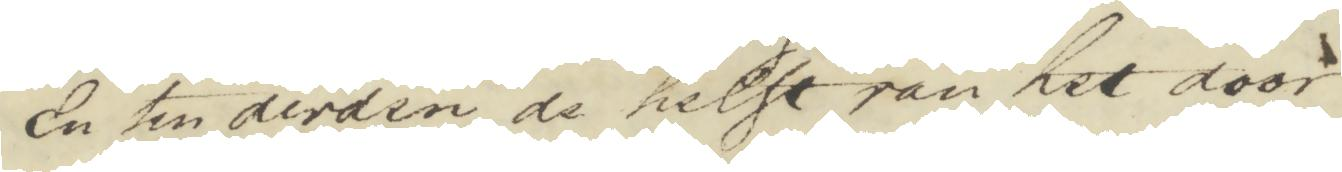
En ten derden de helft van het door
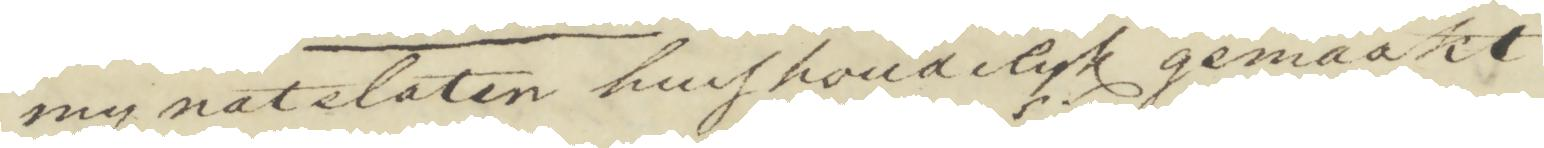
my natelaten huishoudelijk gemaakt
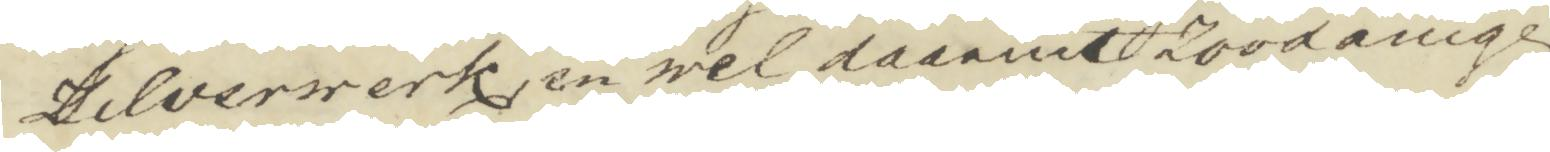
zilverwerk, en wel daaruit zoodanige
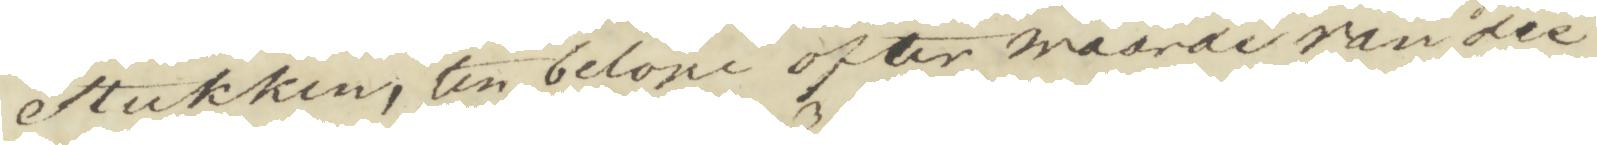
stukken, ten belope of ter waarde van die
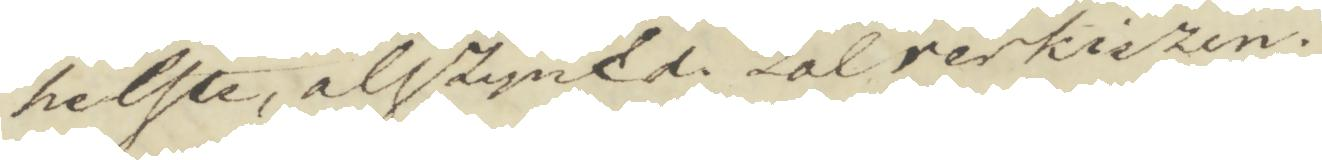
helfte, als zijn Ed. zal verkiezen.
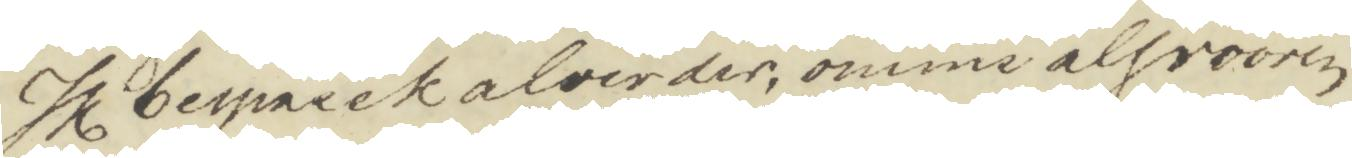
Jk bespreek alverder, omme alsvooren
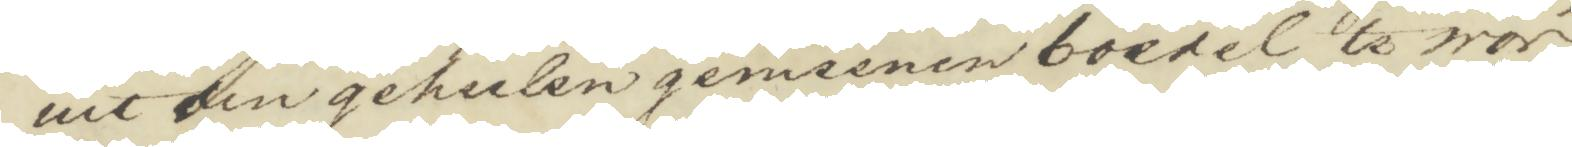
uit den geheelen gemeenen boedel te wor
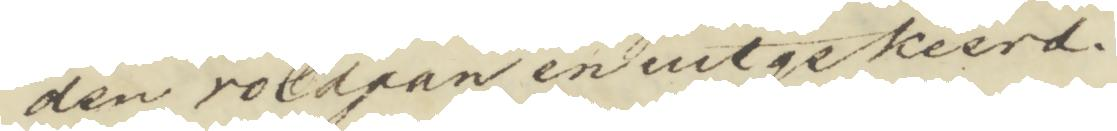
den voldaan en uitgekeerd.
